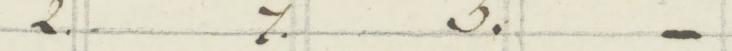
2. 7. 5. —
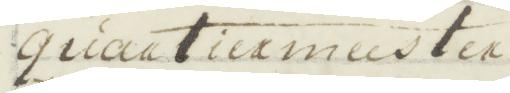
quartiermeester
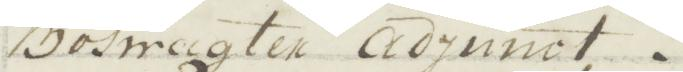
Boswagter adjunct .
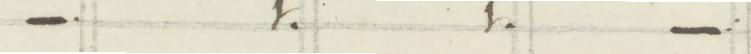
—. 1. 1. —:
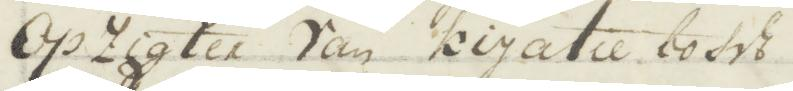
Op Zigter van kijatie bosch
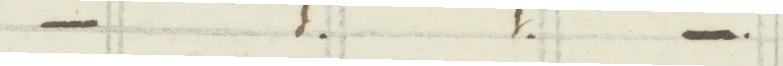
— 1. 1. —.
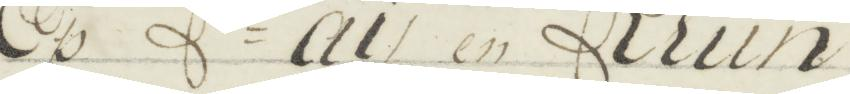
Op P=lo aij en Rhun
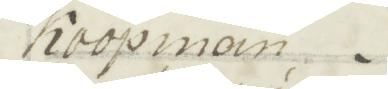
koopman .
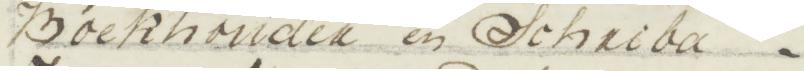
Boekhouder en Schriba .
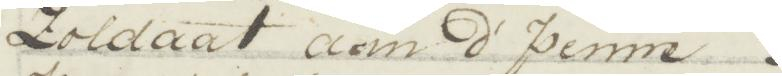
Zoldaat aan d’ penne
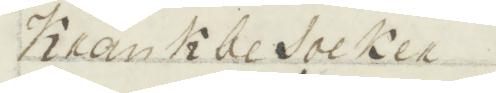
Krankbesoeker
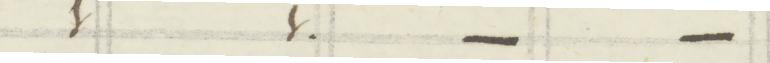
1 1. — —
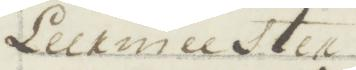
Leermeester
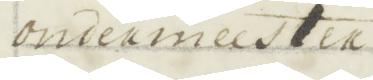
ondermeester
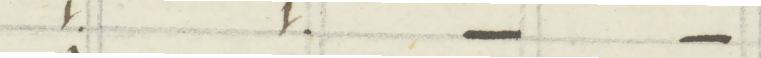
1. 1. — —
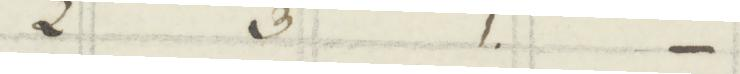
2 3 1. —
